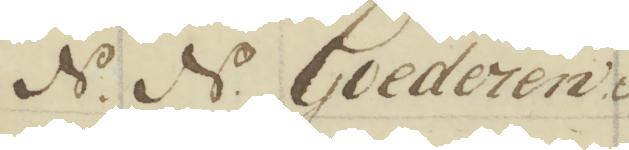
N.o N.o Goederen.
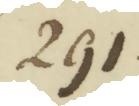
291
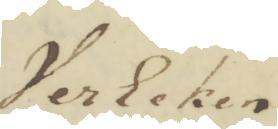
Verheken
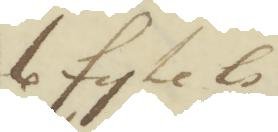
6 fytels
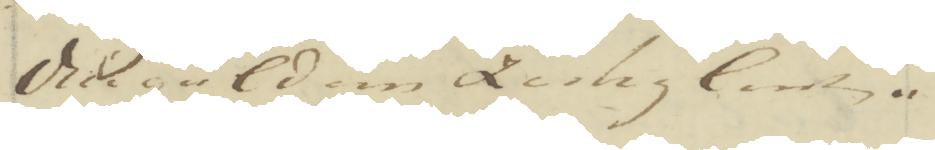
drie guldens Zestig Cents „
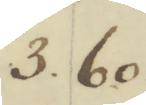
3. 60
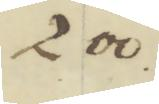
2 00
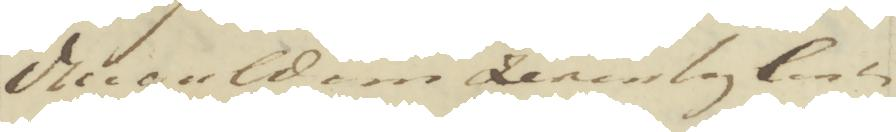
drie guldens zeventig Cents
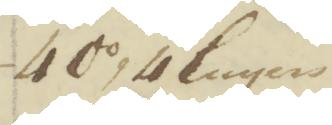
4 d,o 4 luyers
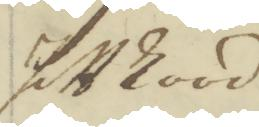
J H rood
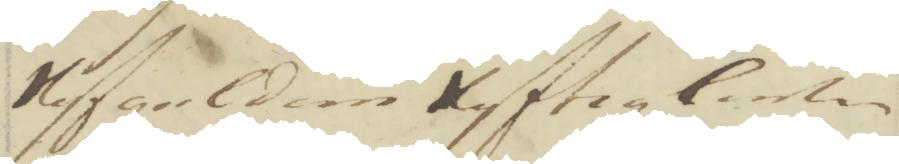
vyf guldens Vyftig Cents
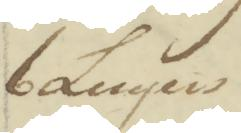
6 Luyers
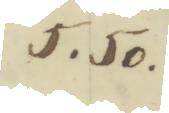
5. 50.
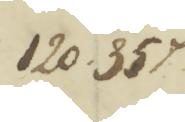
120. 357
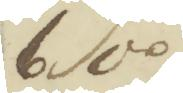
6. do
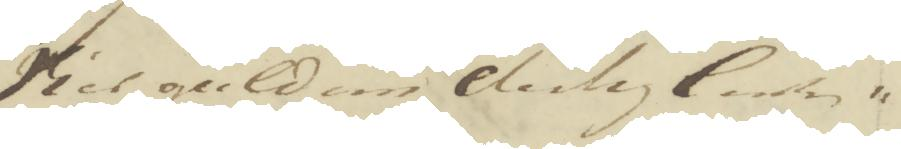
Vier guldens dertig Cents „
